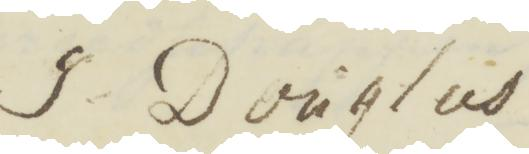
J Douglas
